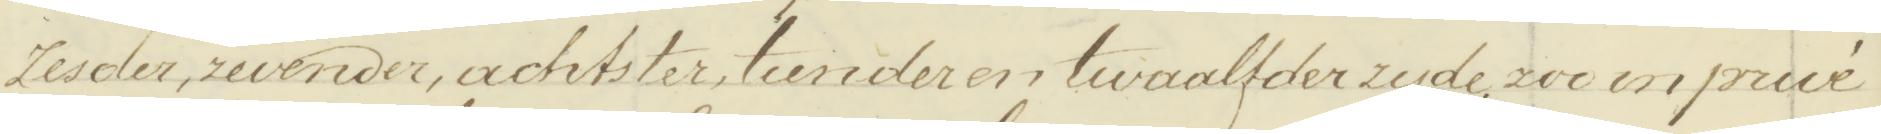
Zesder, zevender, achtster, tiender en twaalfder zyde, zoo in privé
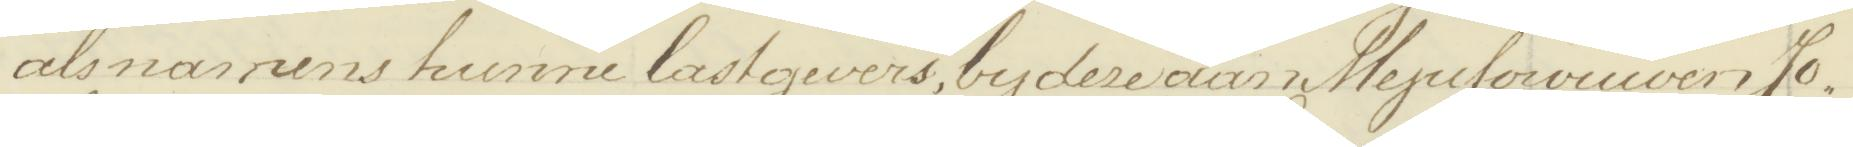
als namens hunne lastgevers, by deze aan Mejufvrouwen Jo„
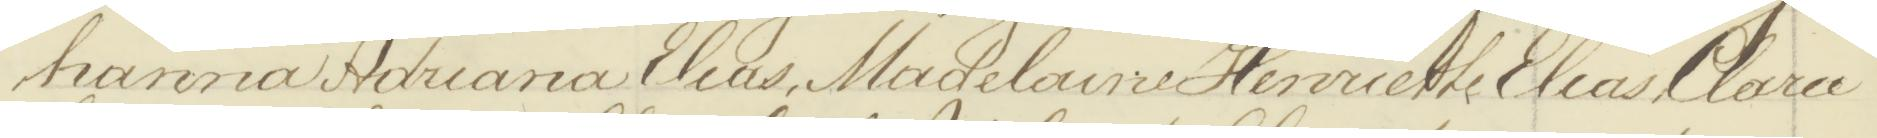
hanna Adriana Elias, Madelaine Henriette Elias, Clara
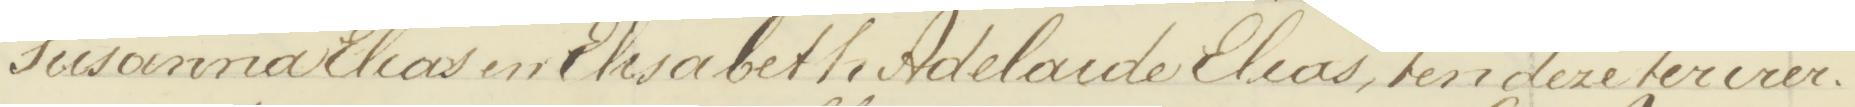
Susanna Elias en Elisabeth Adelaide Elias, ten deze ter vier„
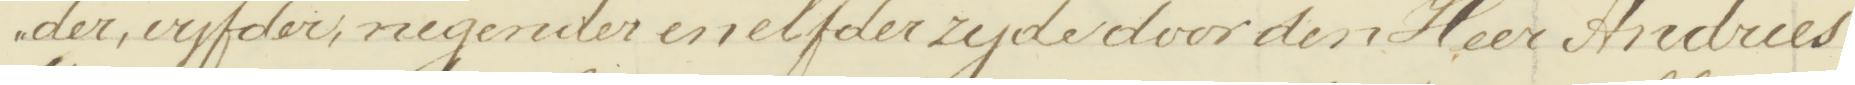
„der, vyfder, negender en elfder zyde door den Heer Andries
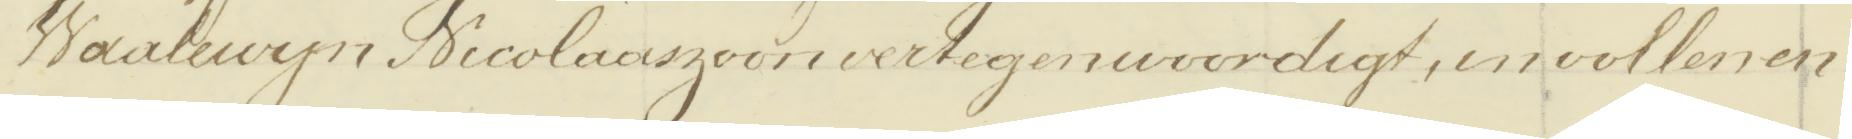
Waalewyn Nicolaaszoon vertegenwoordigt, in vollen en
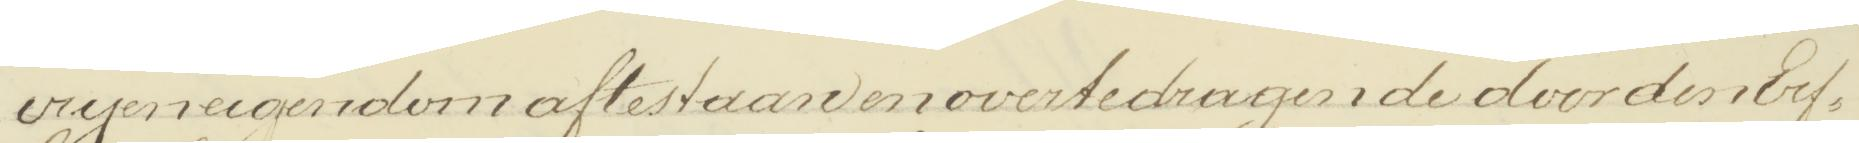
vryen eigendom af te staan en over te dragen de door den Erf„
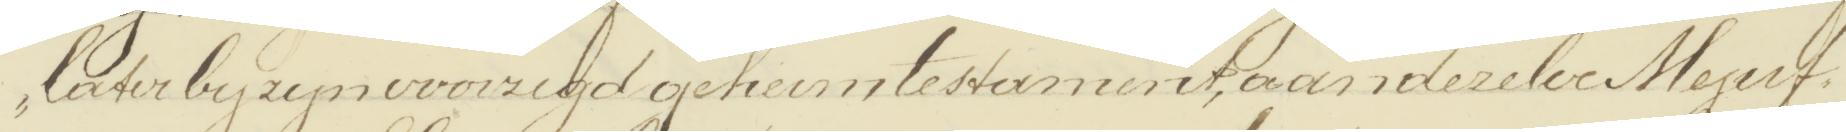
„later by zyn voorzegd geheim testament, aan dezelve Mejuf.
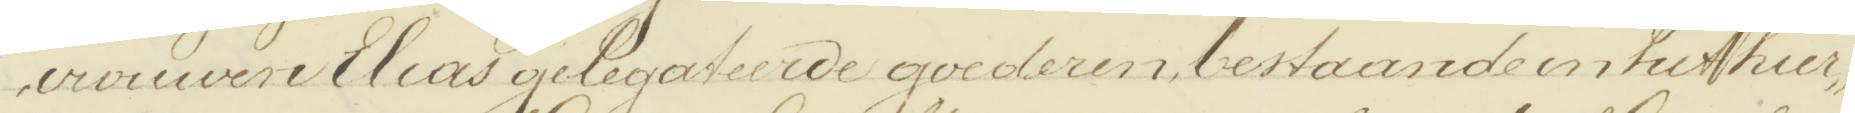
„vrouwen Elias gelegateerde goederen, bestaande in het hier„
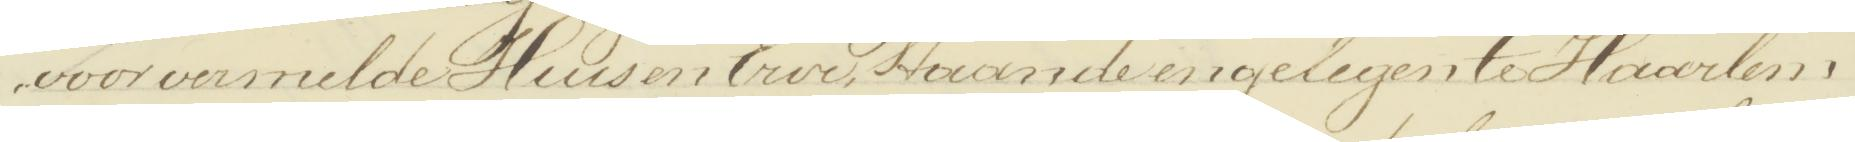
„voor vermelde Huis en Erve, staande en gelegen te Haarlem
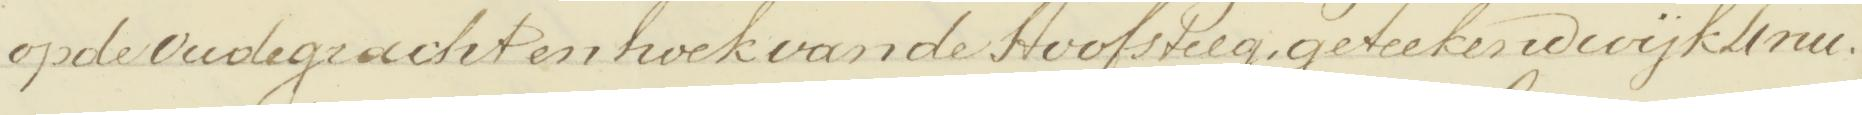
op de Oudegracht en hoek van de Hoofsteeg, geteekend wijk 4 nu.
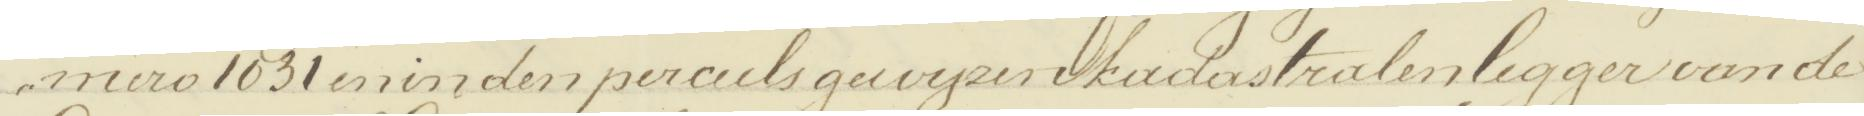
„mero 1031 en in den perceels gewyzen kadastralen ligger van de
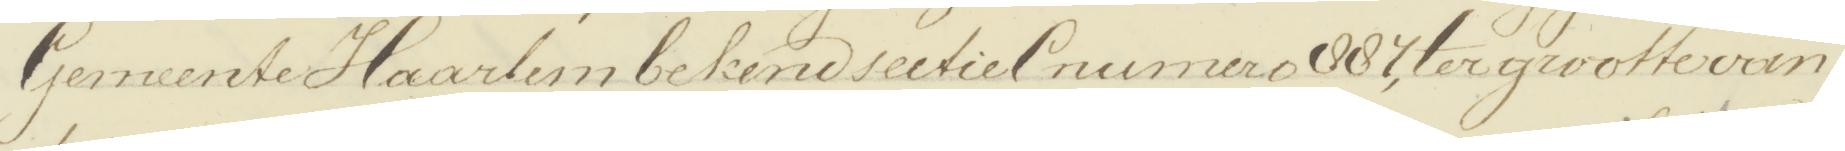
Gemeente Haarlem bekend sectie C numero 887, ter grootte van
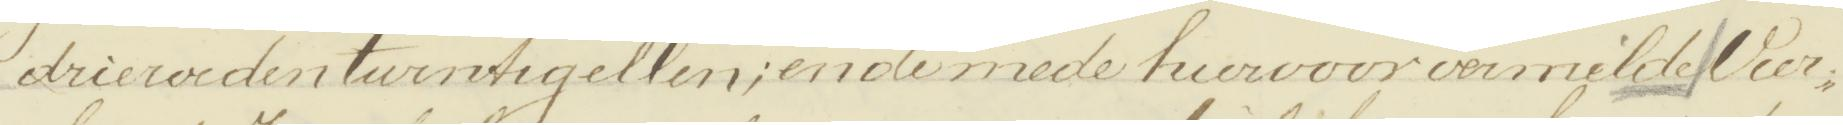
drie roeden twintig ellen; en de mede hiervoor vermelde / Vier„
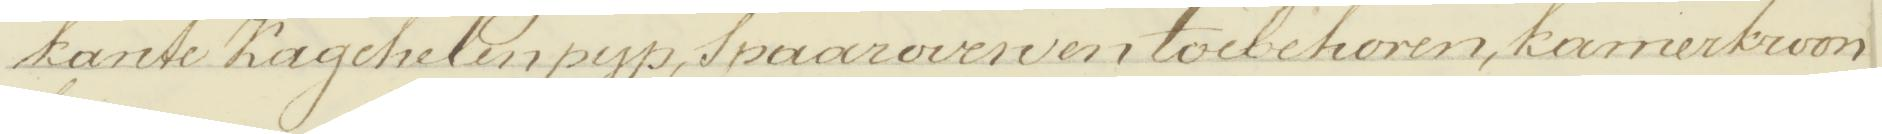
kante Kagchelen pyp, Spaaroven en toebehoren, kamerkroon,
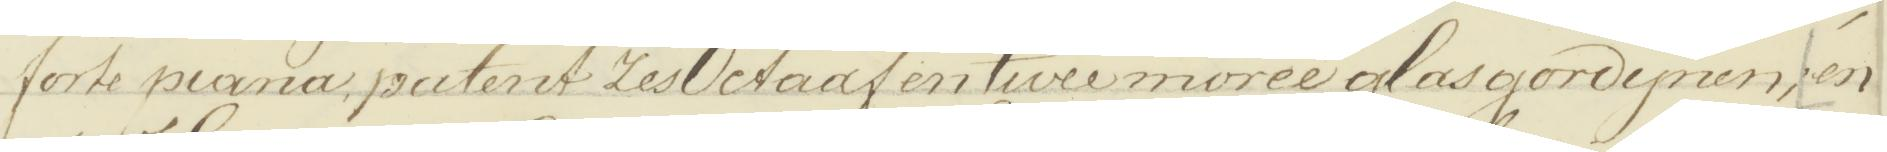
forte piana patent Zes Octaaf en twee moree glasgordynen,/ en
